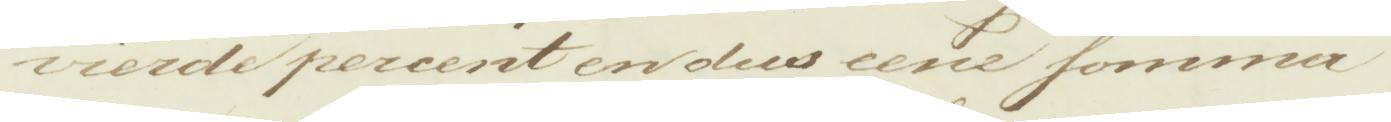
vierde percent en dus eene somma
